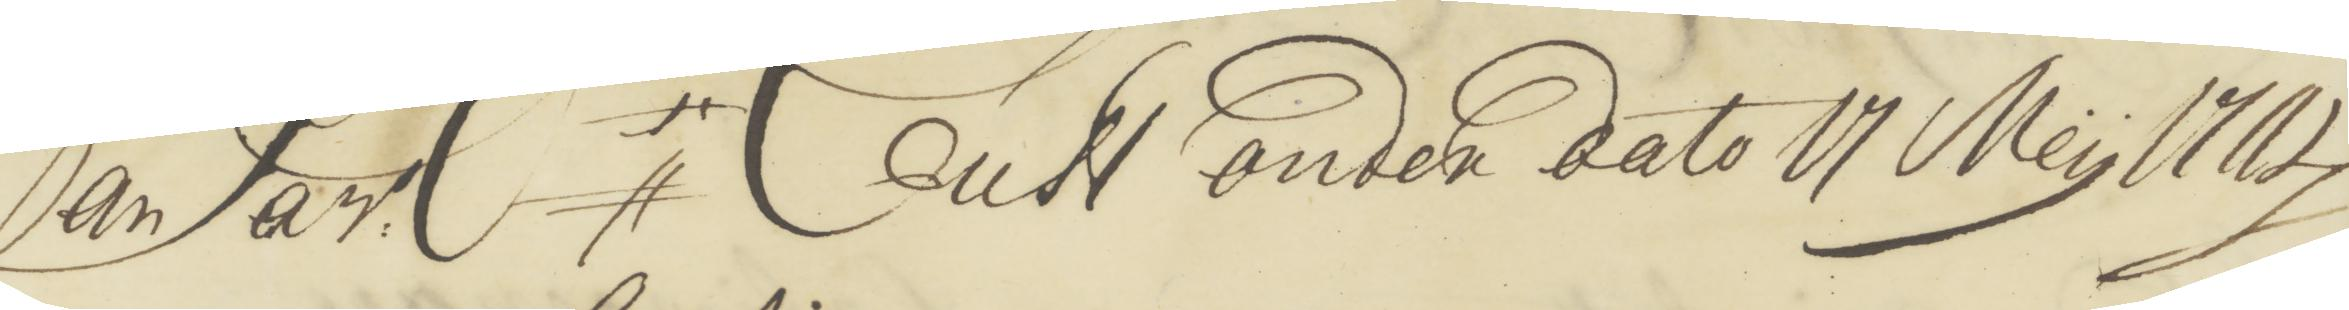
Van Jav:s O„st Cust onder dato 17 Meij 1741
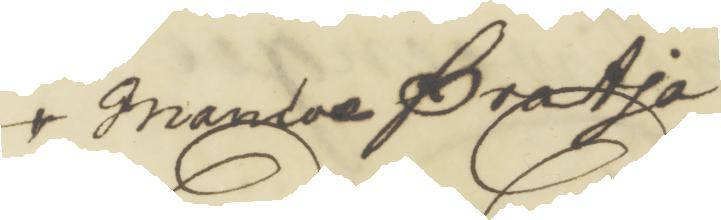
# mancoe Pratja
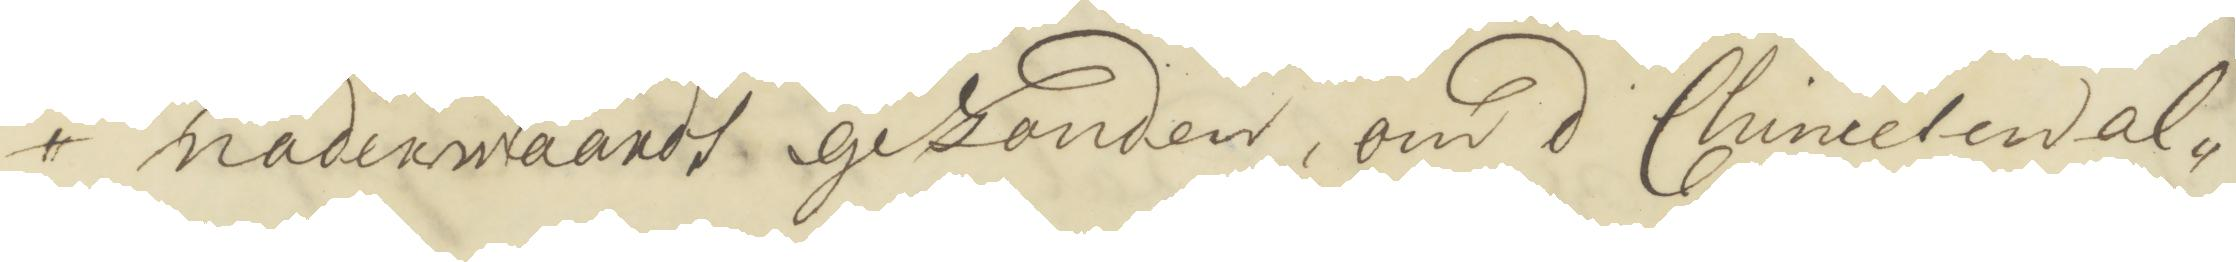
# naderwaards gezonden, om d’ Chineesen al„
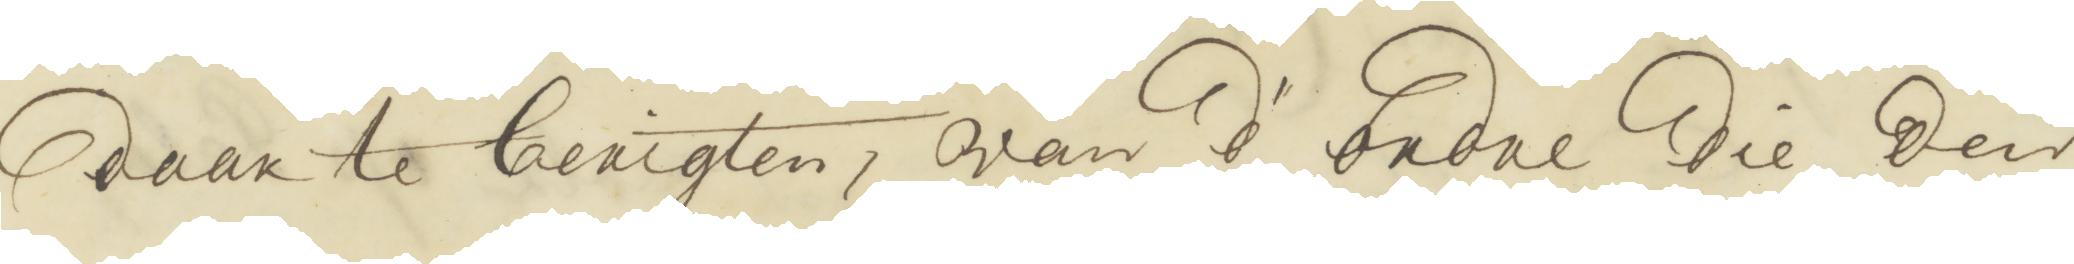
daar te berigten, van d’ ordre die den
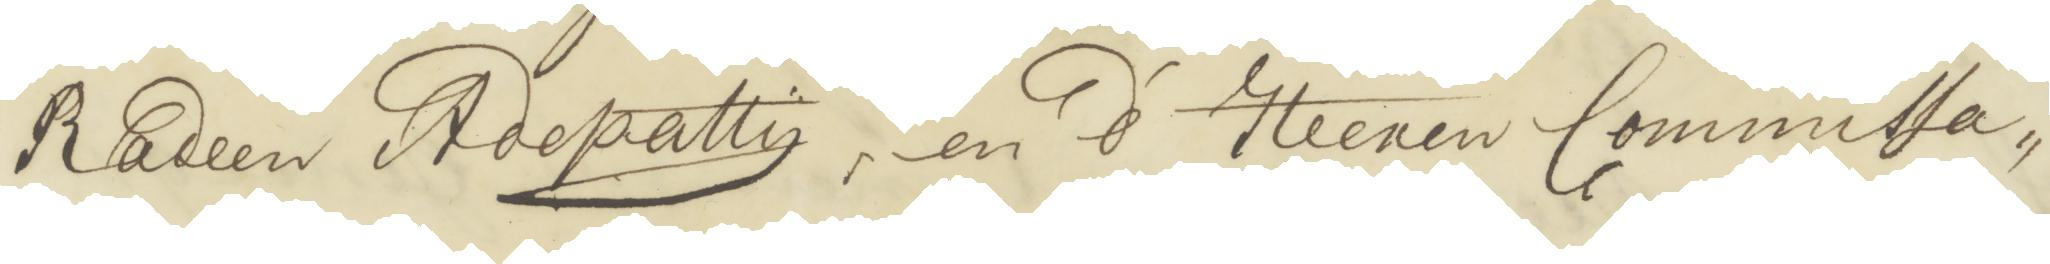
Radeen Adepattij, en d’ Heeren Commissa„
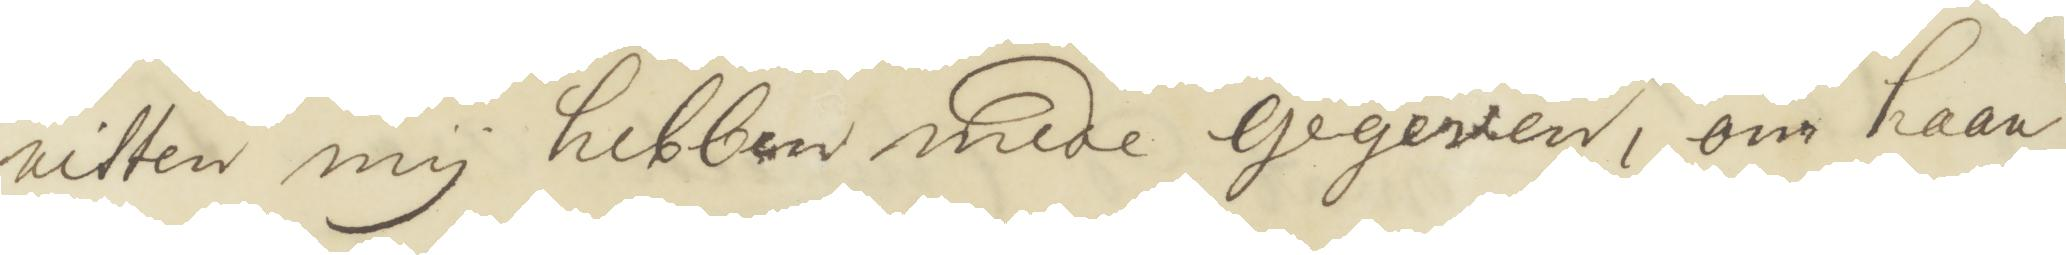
rissen mij hebben mede gegeven, om haar
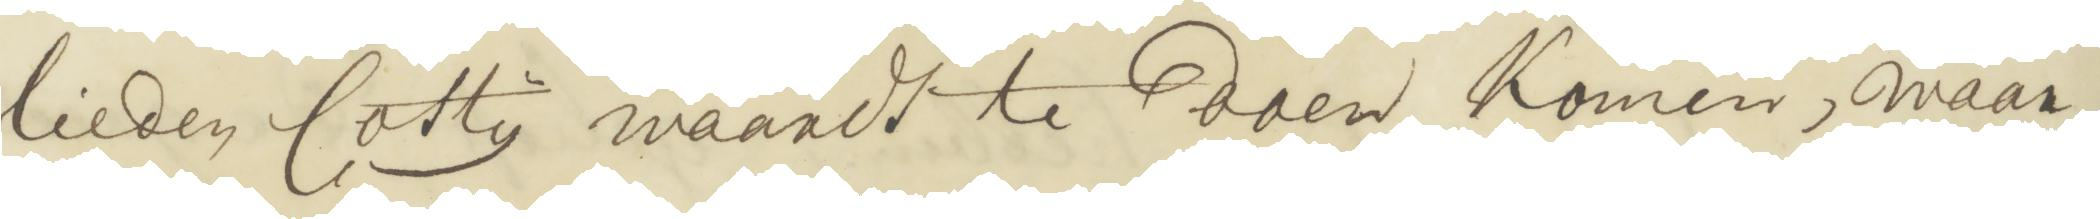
lieden Costij waards te doen komen, waar
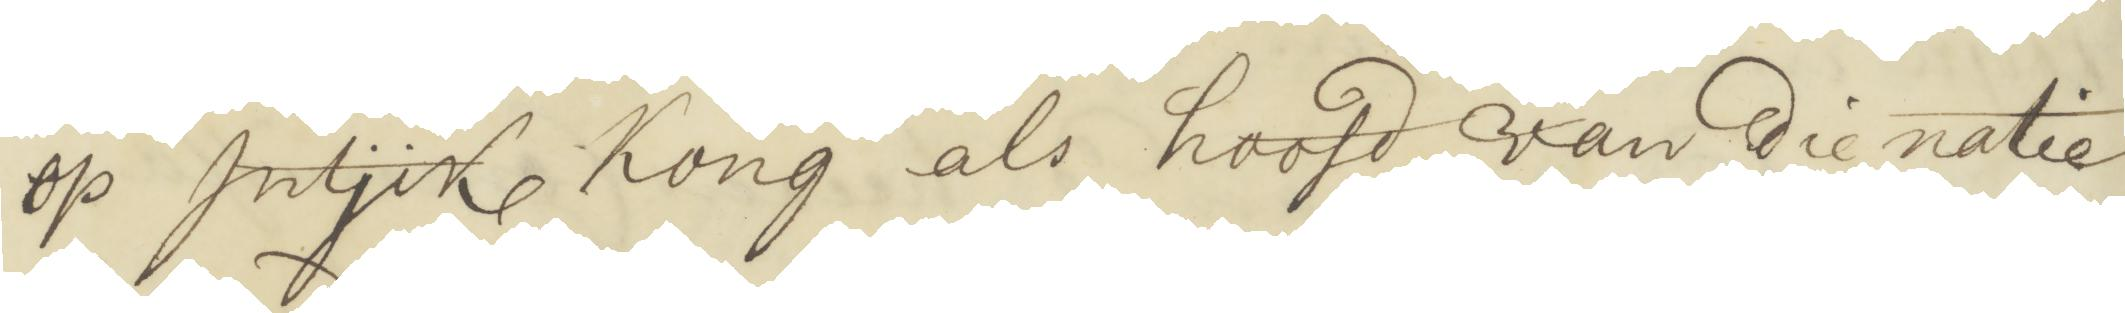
op Jntjik Kong als hoofd van die natie
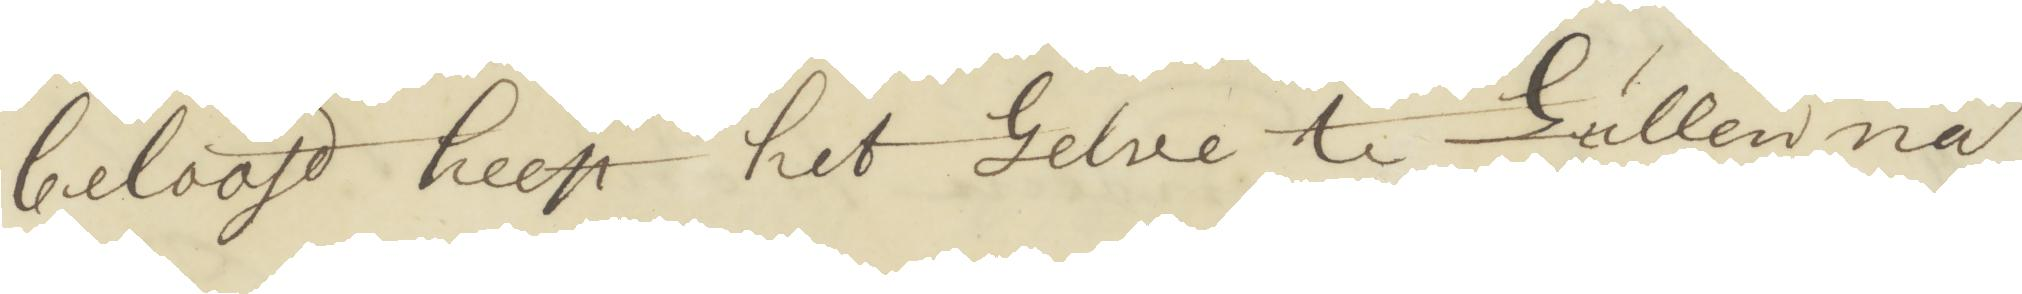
beloofd heeft het zelve te zullen na
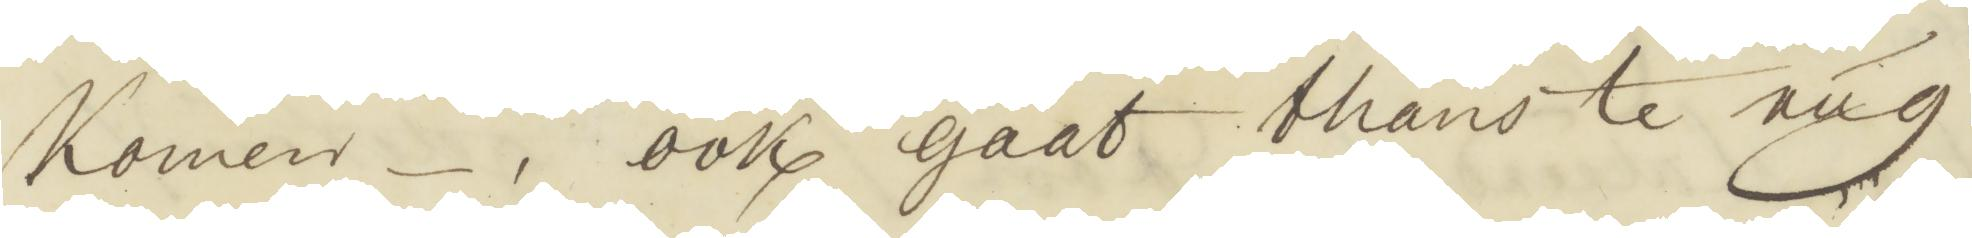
Komen —, ook gaat thans te rug
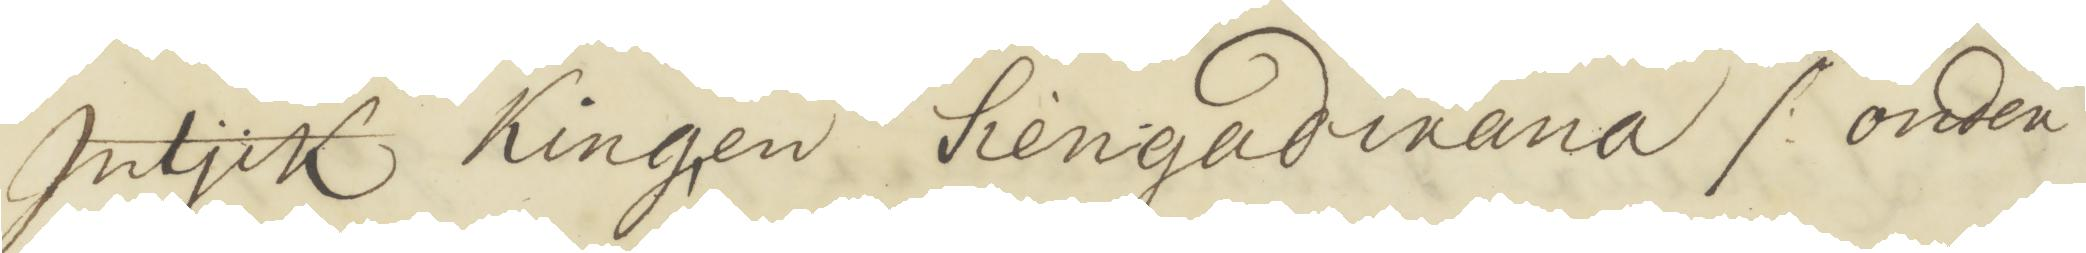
Jntjik Kingen siengadirana /:onder
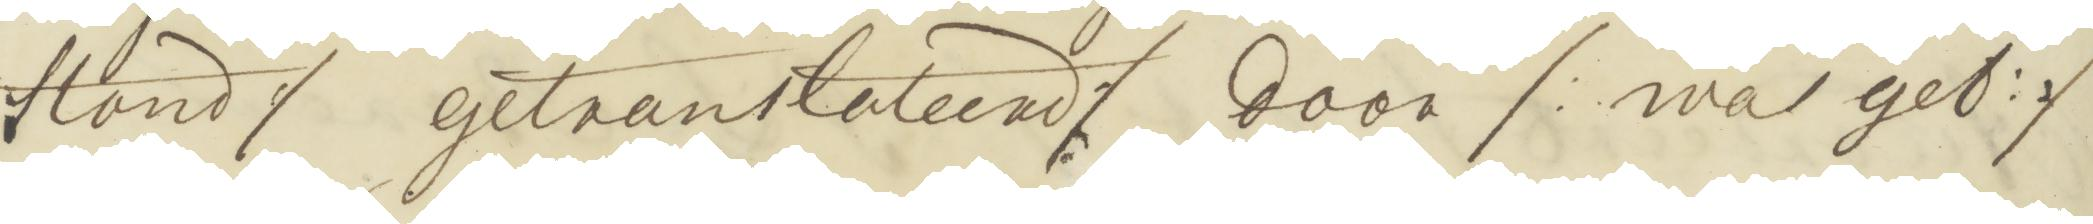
stond./ getranslateerd./ door /: was get:/
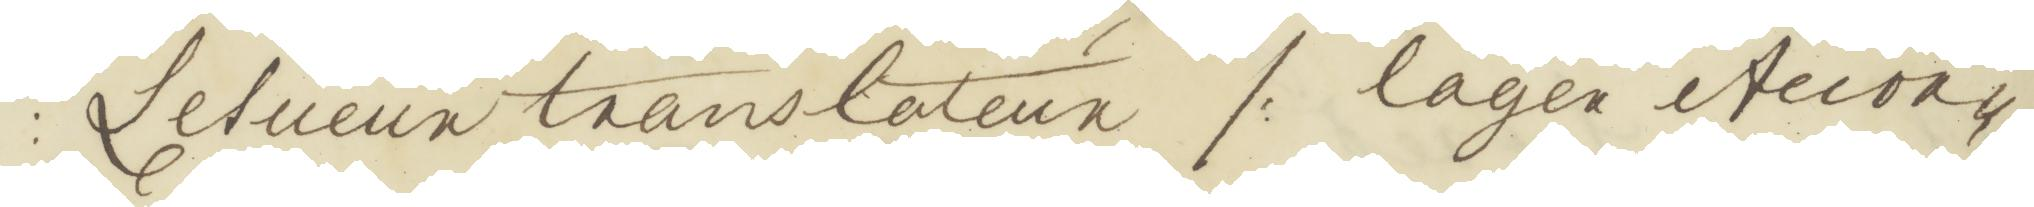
P:s Lesueur translateur /:lager Accor
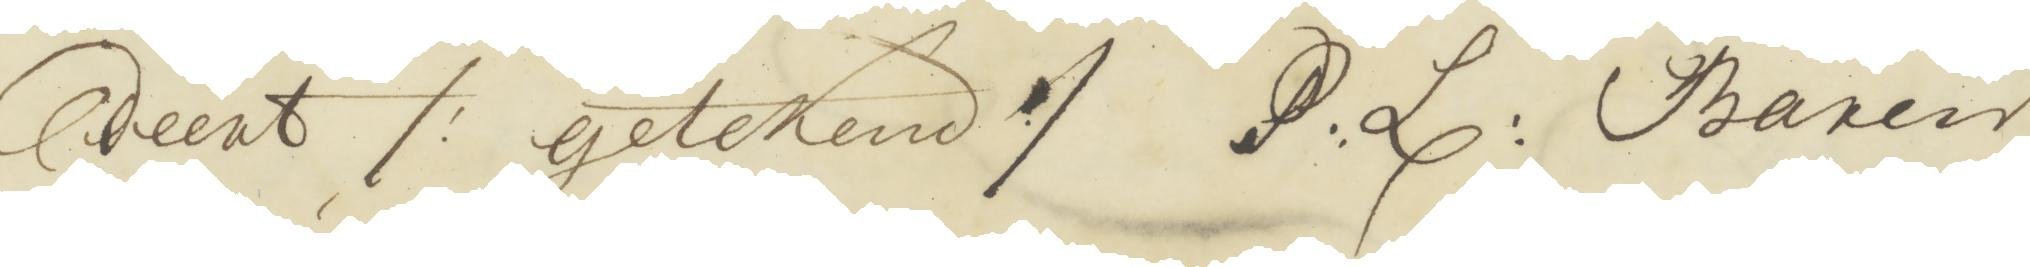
deert /: getekend./ P: L: Baren
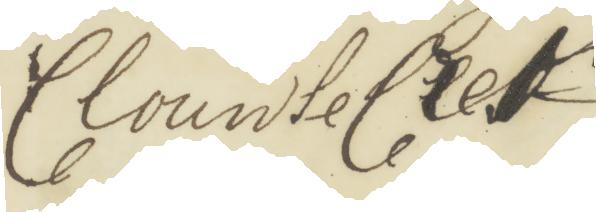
Clouw seCret=t
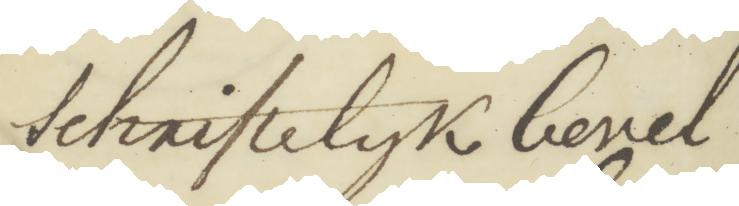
schriftelyk bevel
